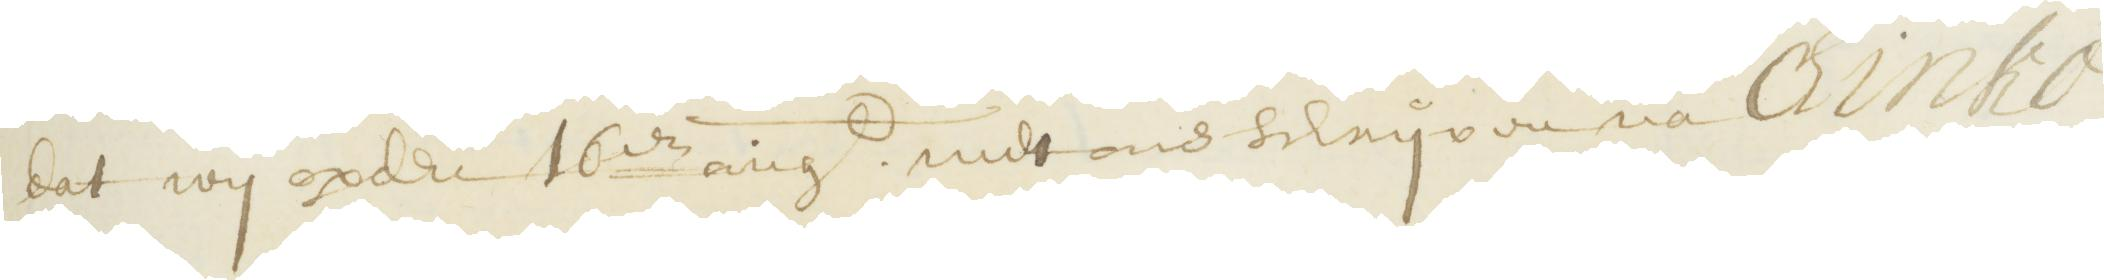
dat wij opden 16=en aug.o met ons schrijven na Chinko
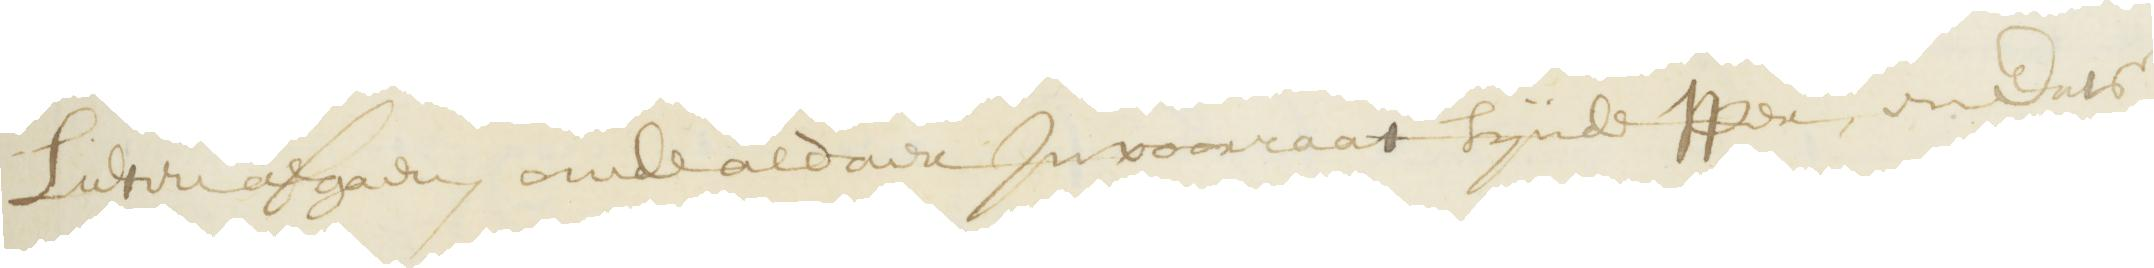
Lieten afgaen, omde aldaer Jnvoorraat sijnde peper, en Erts
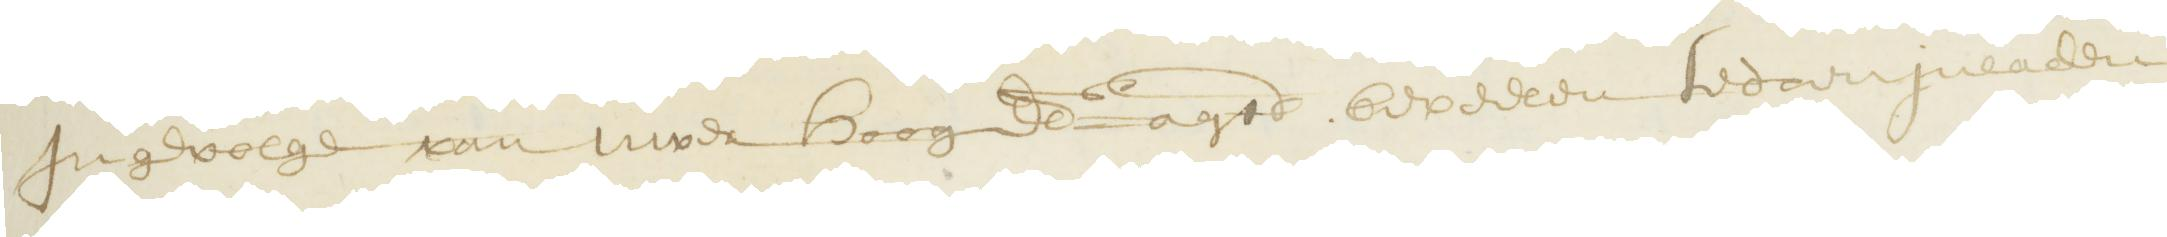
Jngevolge van uwer Hoog Ed=s agtb. beveelen tedoen jnladen
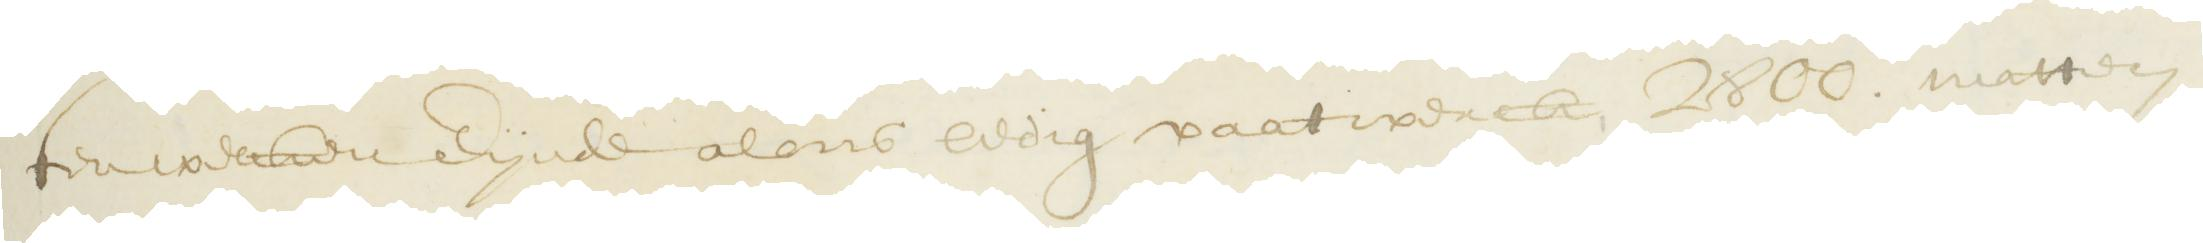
ten welken Eijnde alons ledig vaatwerck 2800. matten
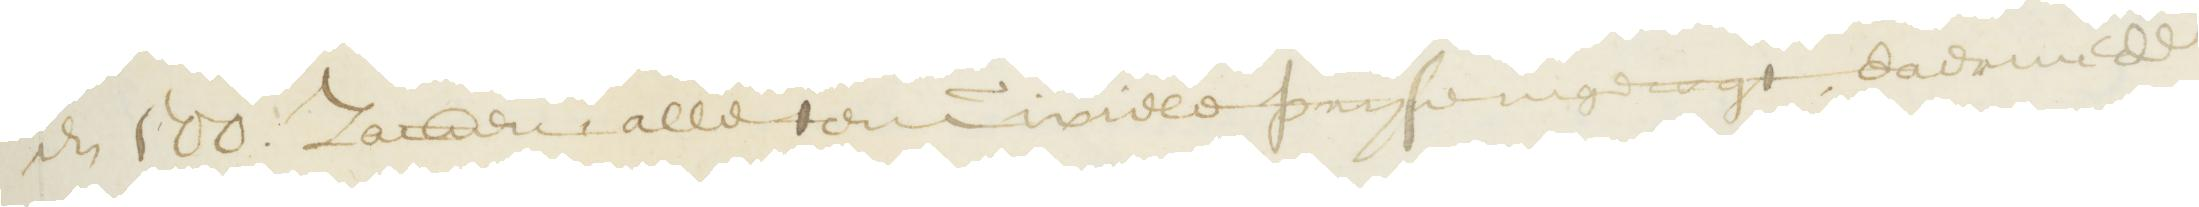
en 100: Zacken alle ten civiele prijse ingecogt, daermede
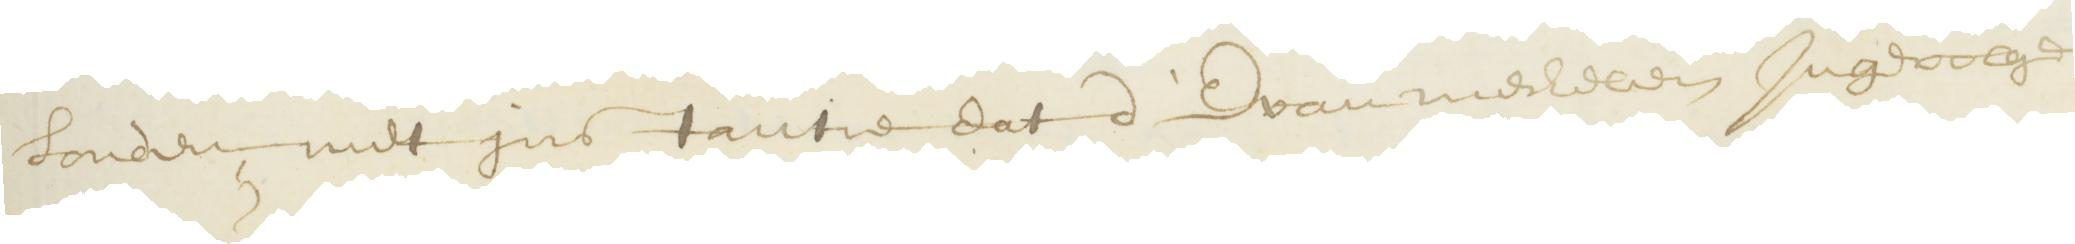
sonden met jnstantie dat d’ Evan mechelen Ingevolge
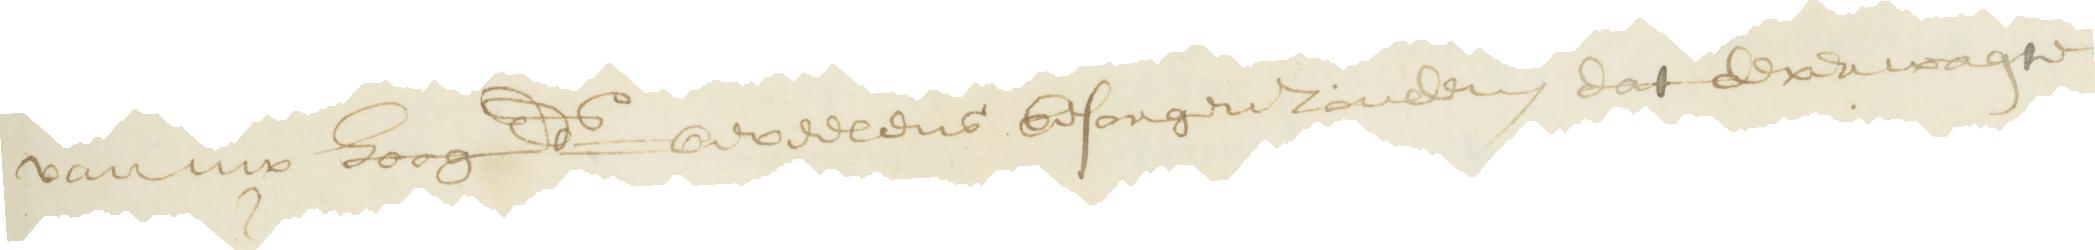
van uw Hoog Ed=s beveelens besorgen Zouden, dat deverwagte
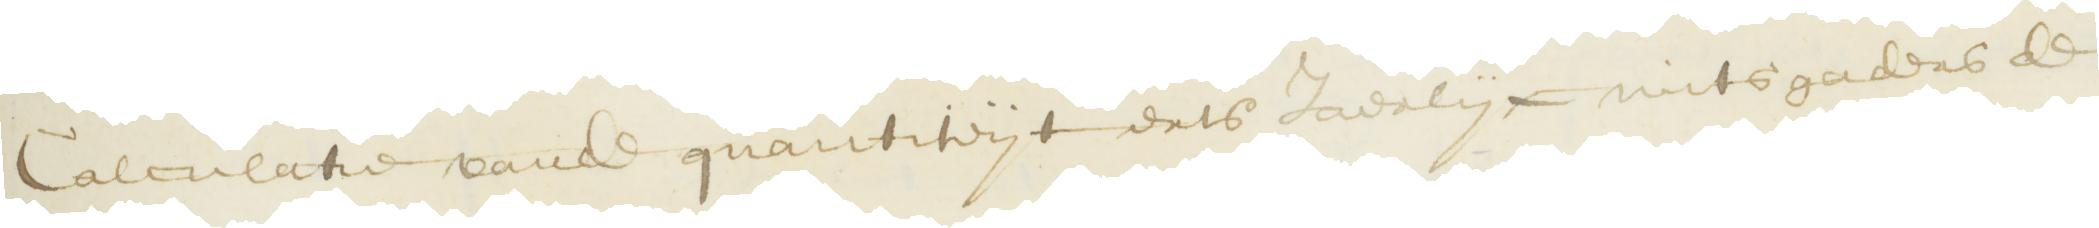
Calculatie vande quantiteijt erts Iaerlijx mitsgaders de
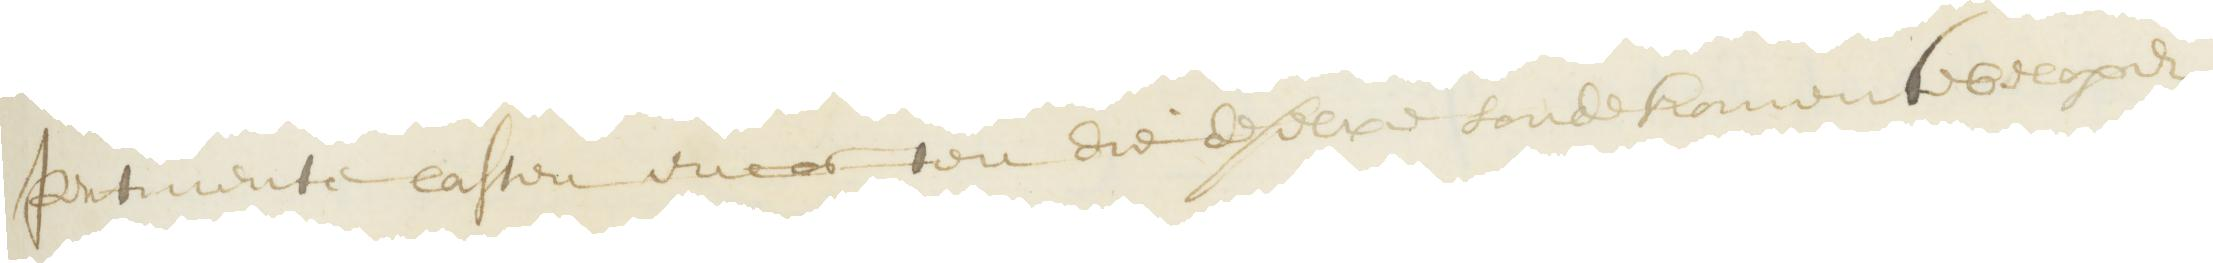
pertinente lasten encosten die deselve soude komen te belopen
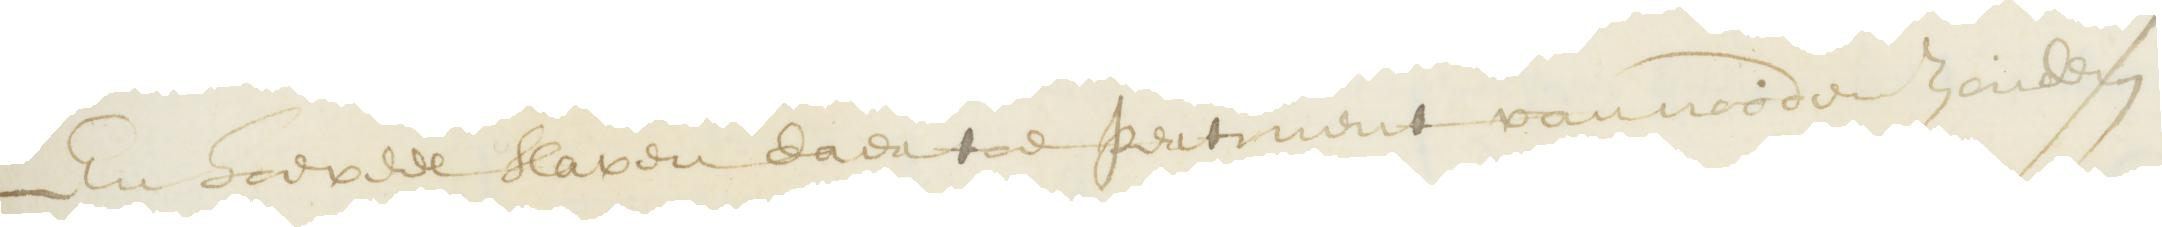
En hoeveel slaven daer toe pertinent van noode Zouden
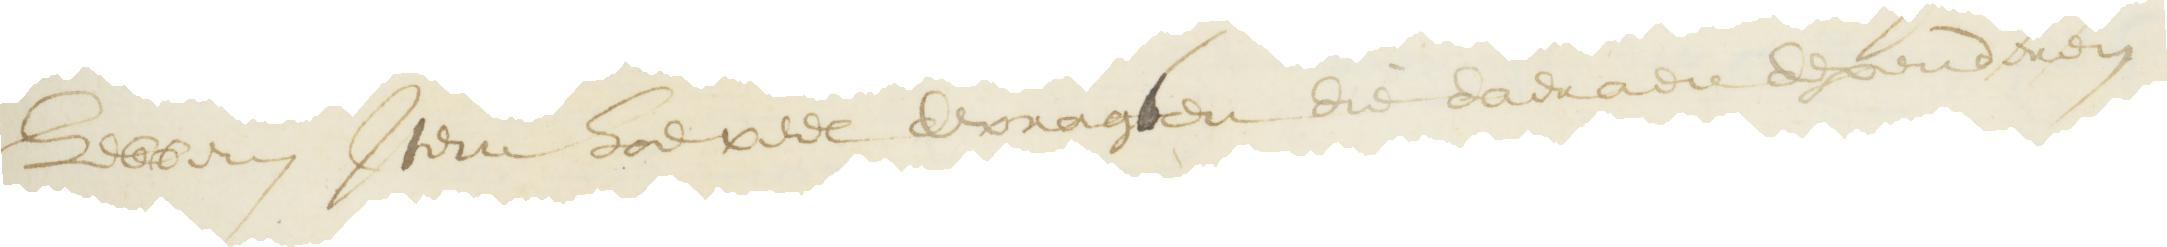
Hebben, Jtem hoeveel devragten die daeraen devenderen
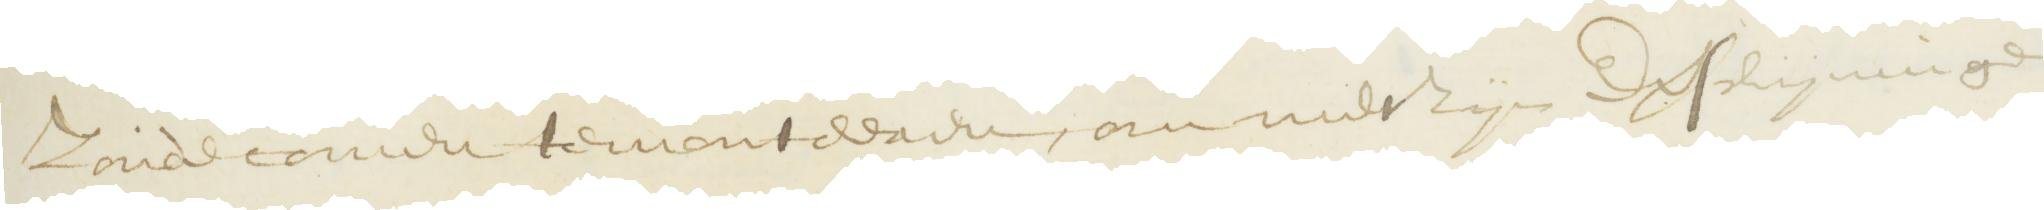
Zoude comen temonteeren, om niet zijn Everschijninge
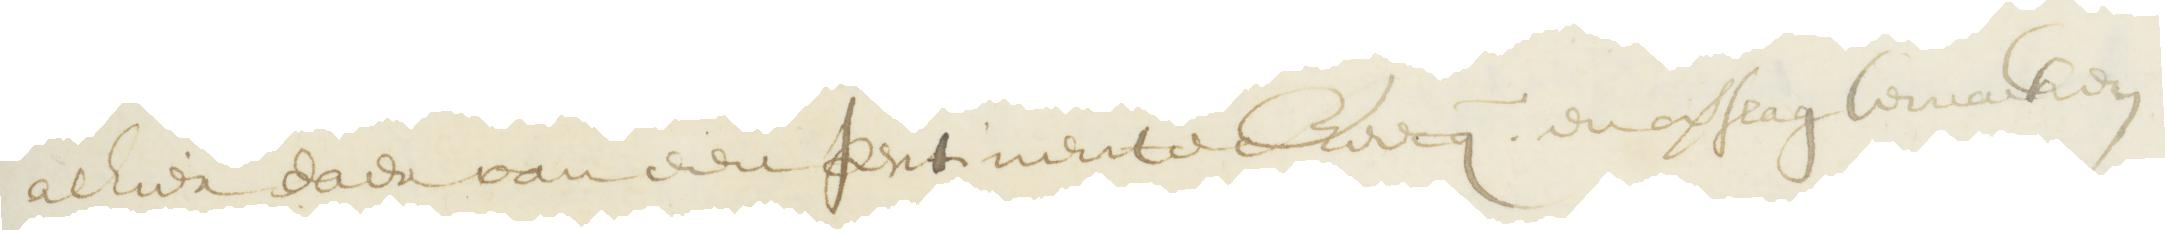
alhier daer van een pertinente Reecq. en overslag temaeken
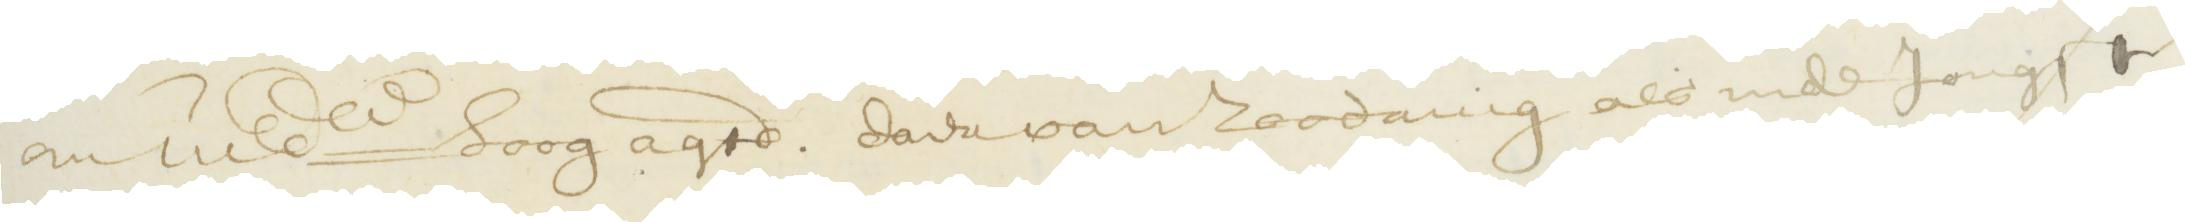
an uEd=le hoog agtb. daer van Zoodanig als inde Jongst
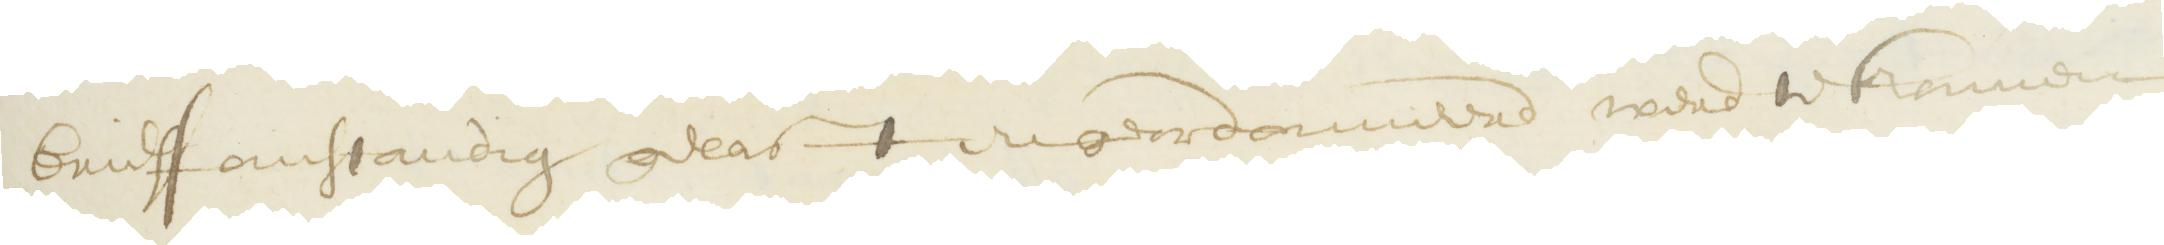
brieff omstandig gelast en geordonneerd werd te konnen
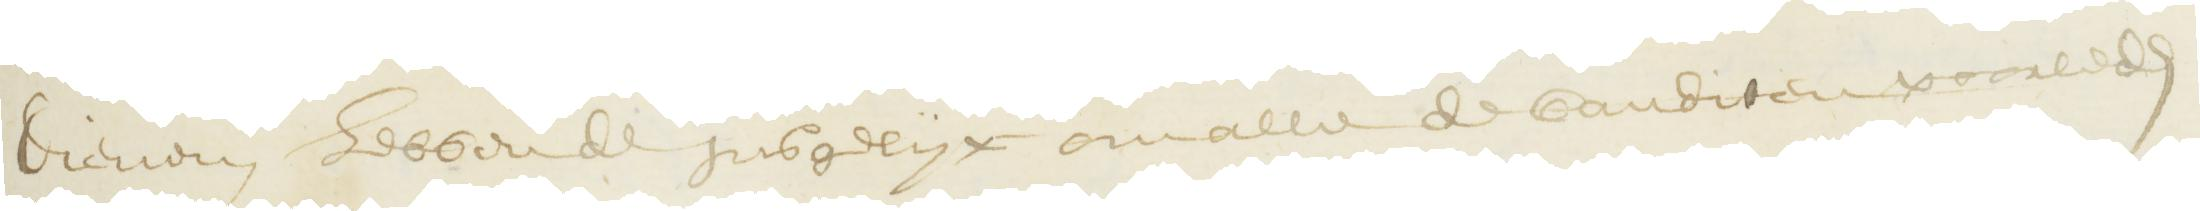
dienen, hebbende jnsgelijx om alle de banditen voorleden
